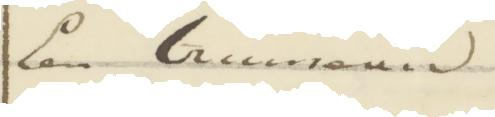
Een trumeau
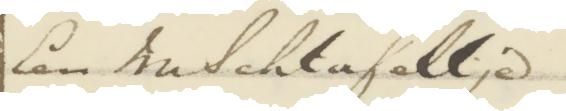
Van waschtafeltje
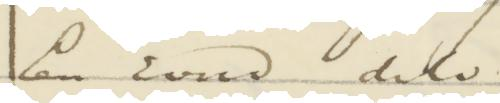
Een rond dito
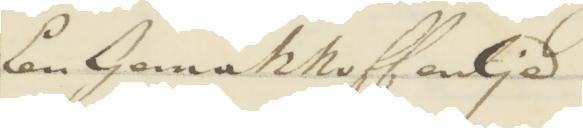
Een Gemakkoffertje
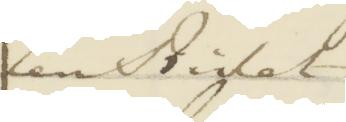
Een Bidet
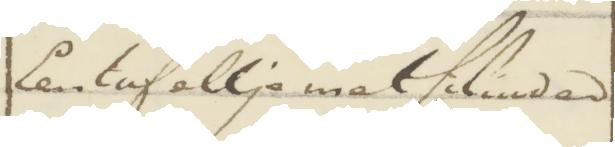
Een tafeltje met cilinder
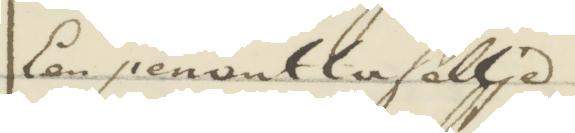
Een penanttafeltje
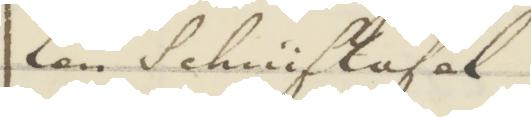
Een schrijftafel
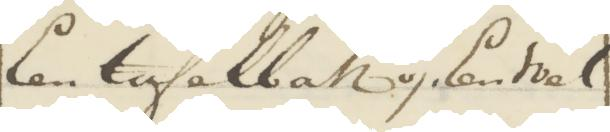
Een tafellak op een wet
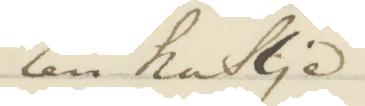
Een kastje
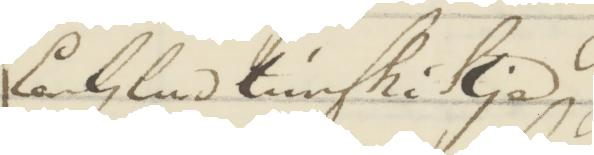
Een Glad turfkistje
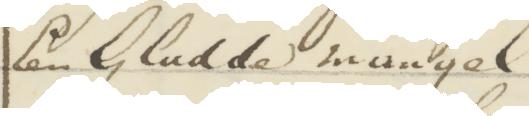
Een Gladde mangel
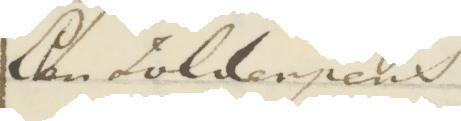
Een zolderpers
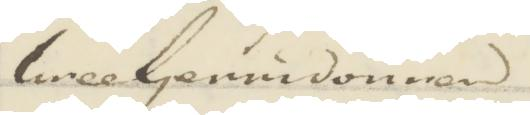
twee Gerridonnen
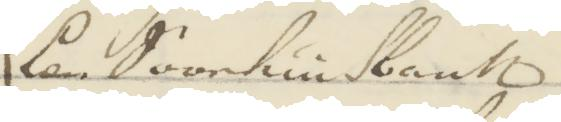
Een Voorhuisbank
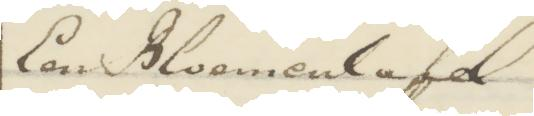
Een Bloementafel
